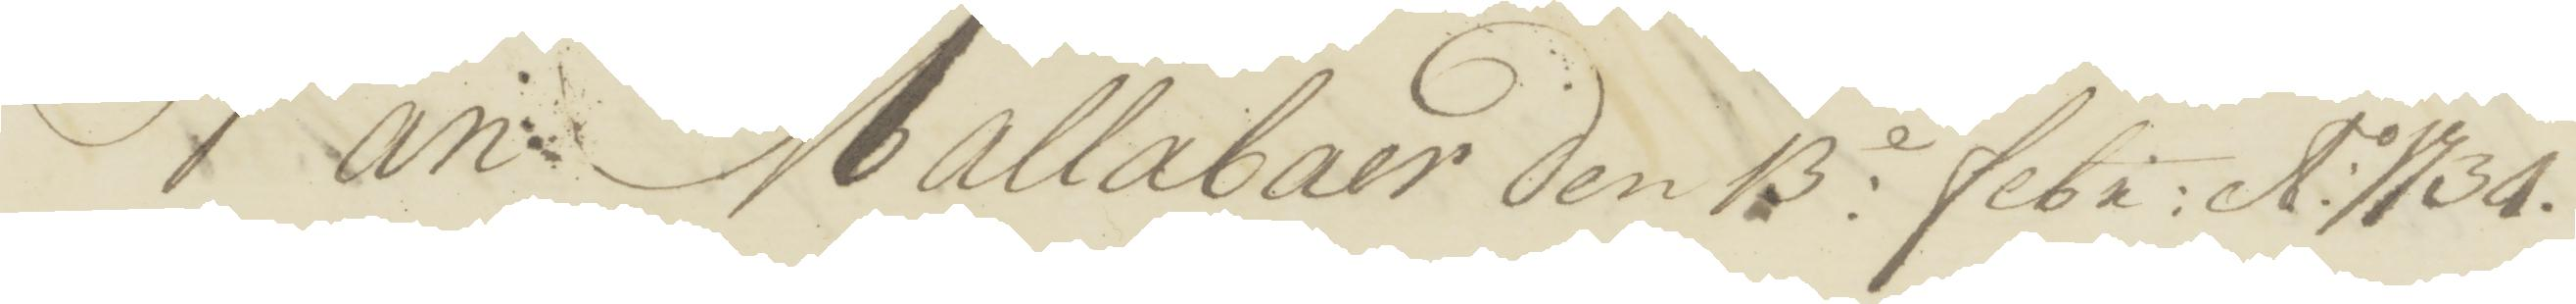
Van Mallabaer den 13:e febr: A:o 1734.
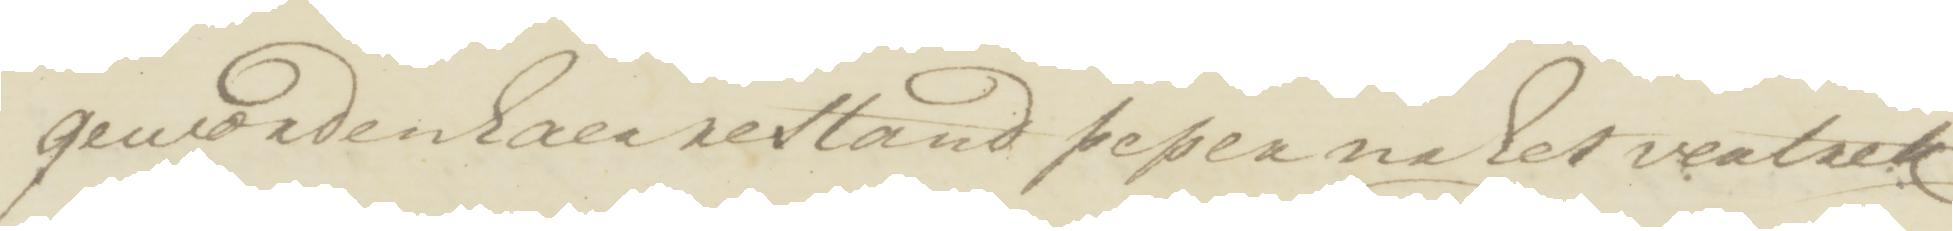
geworden haer restand peper na het vertrek
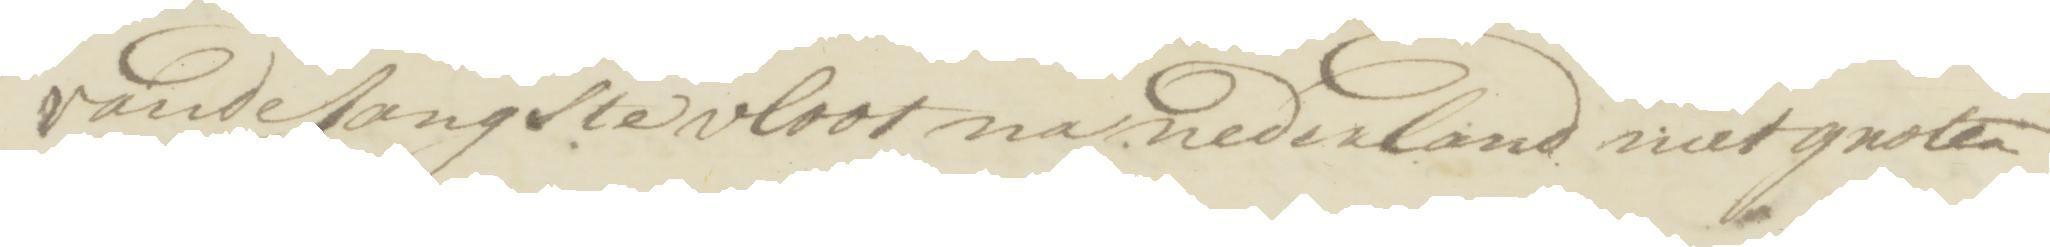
van de jongste vloot na nederland niet groter
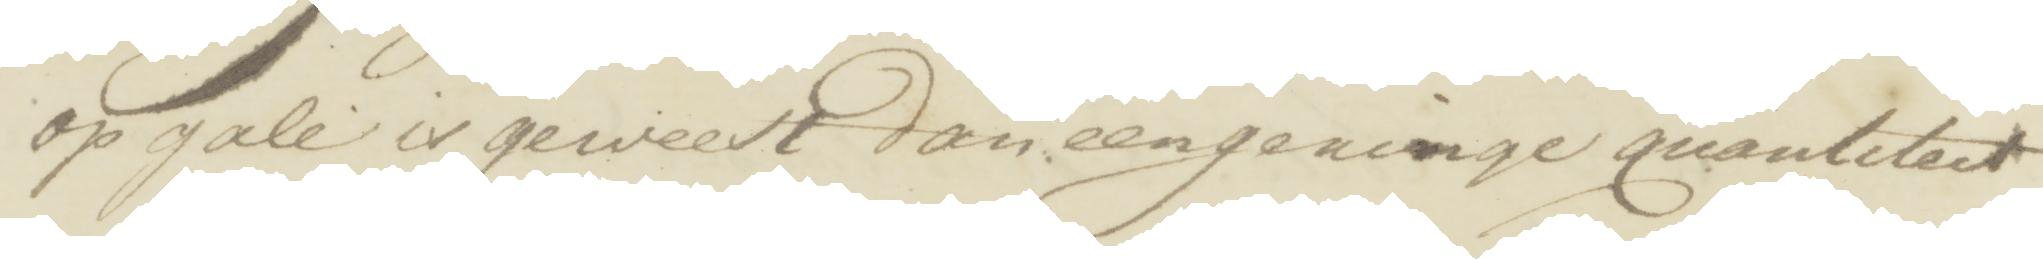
op gale is geweest dan een geringe quantiteit
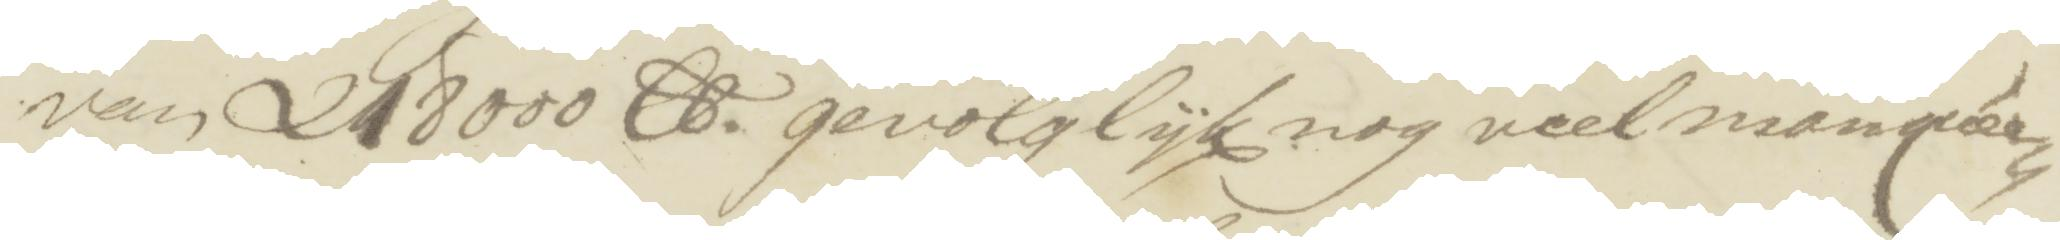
van 248000 lb. gevolglijk nog veel manquee„
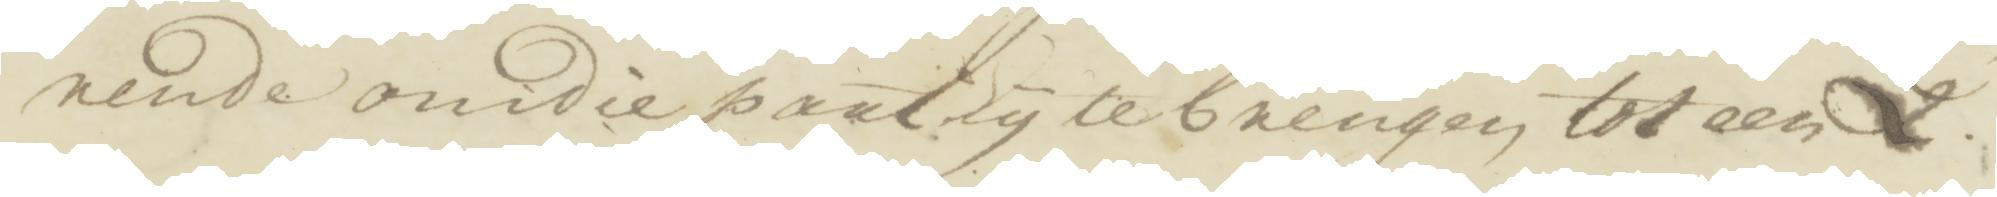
rende om die partij te brengen tot een 2.
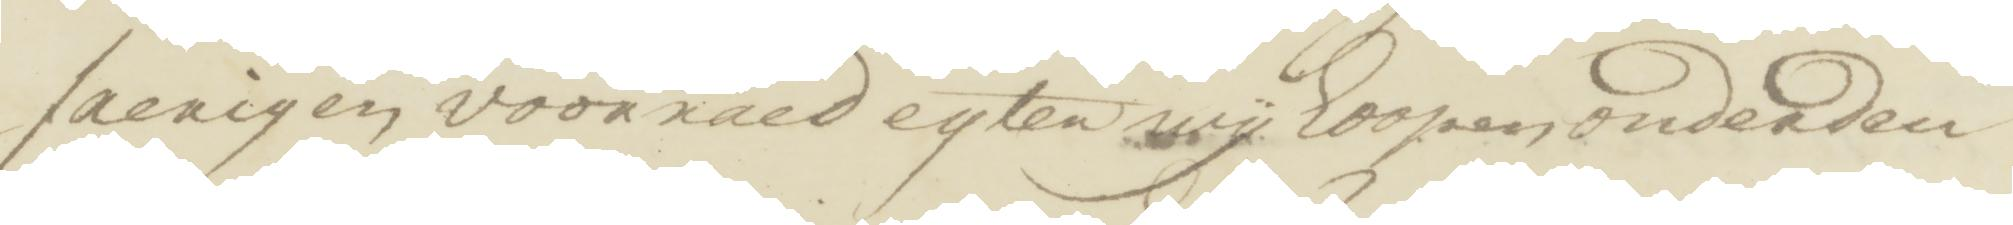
jaerigen voorraed egter wij hoopen onder den
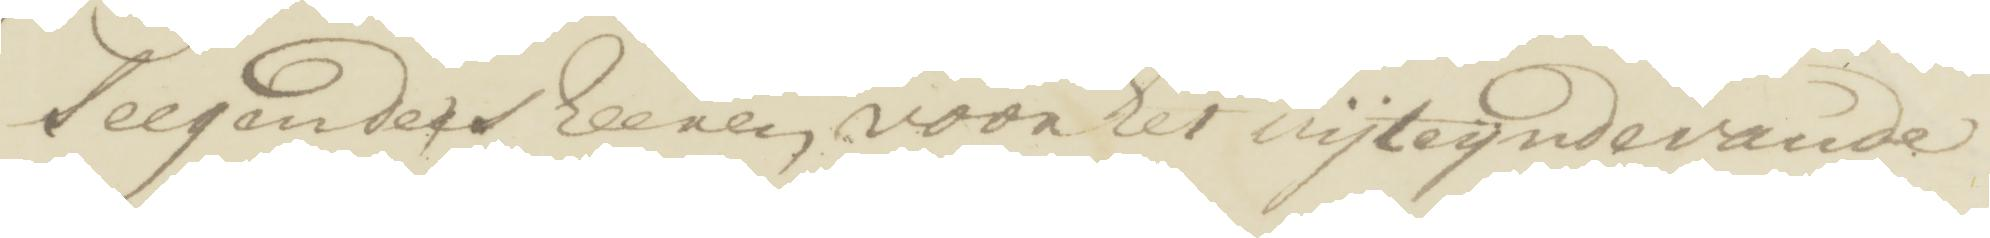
seegendees heeren voor het uijteijnde vande
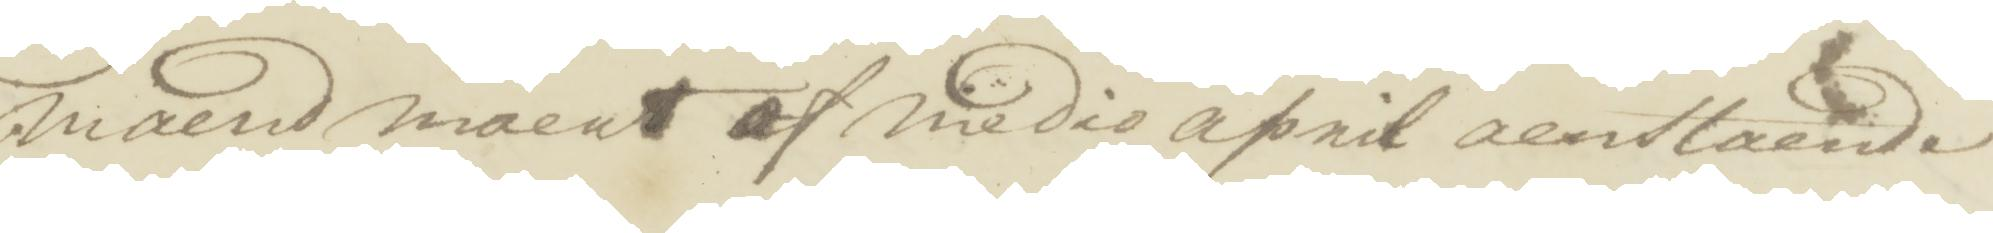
maend maert af medio april aenstaende
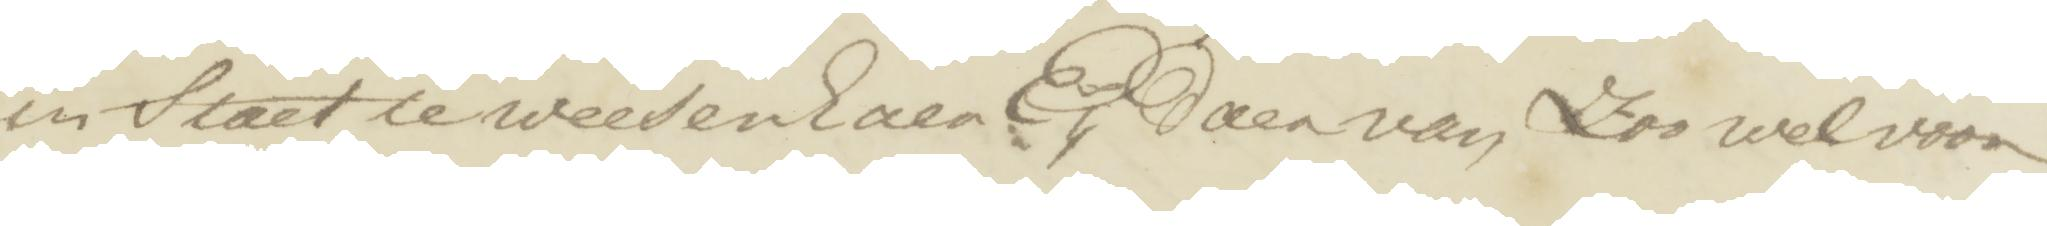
in staet te weesen haer E„s daer van zoo wel voor
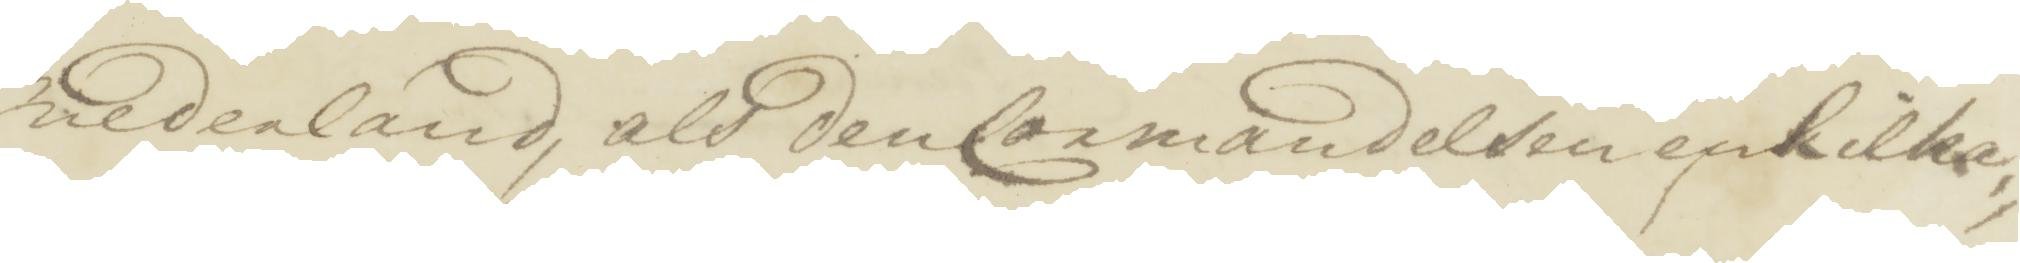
nederland, als den Cormandelsen en kilka
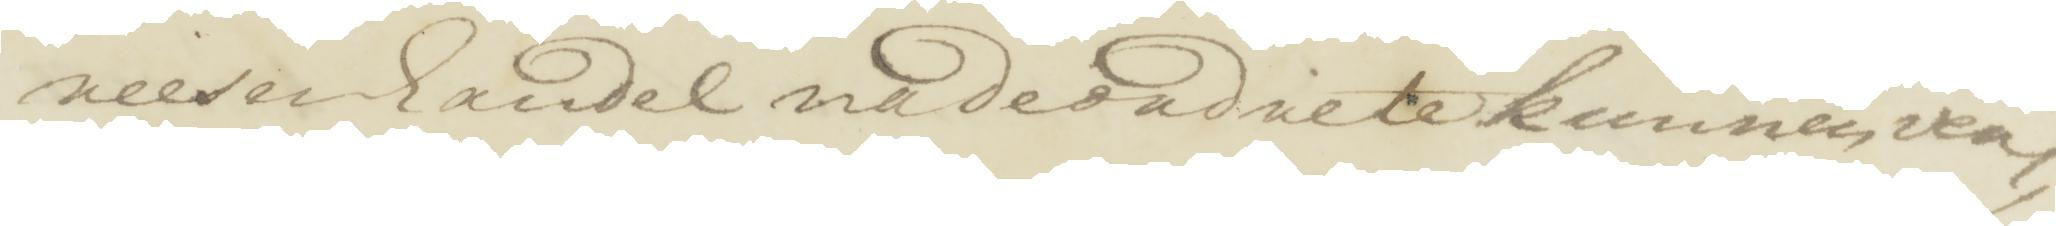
reesen handel na de ordre te kunnen ver„
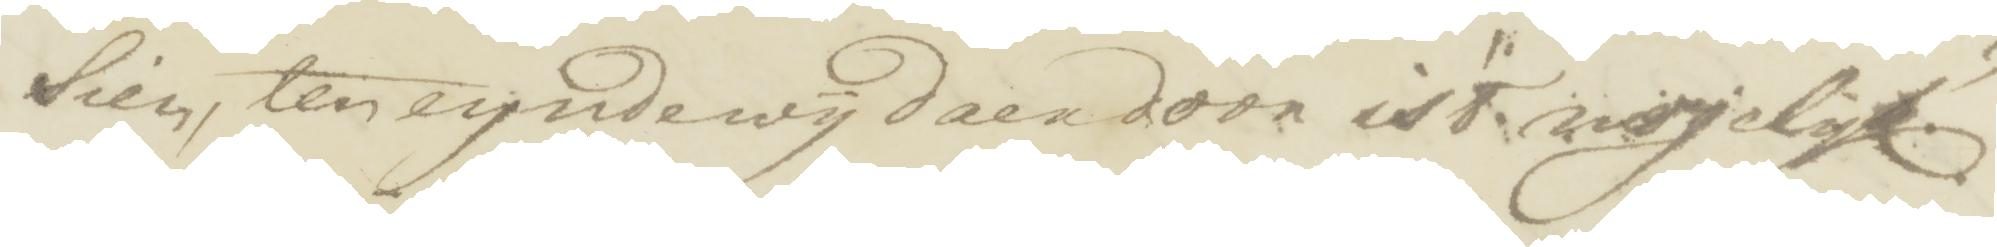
sien, ten eijnde wij daer door is 't mogelijk
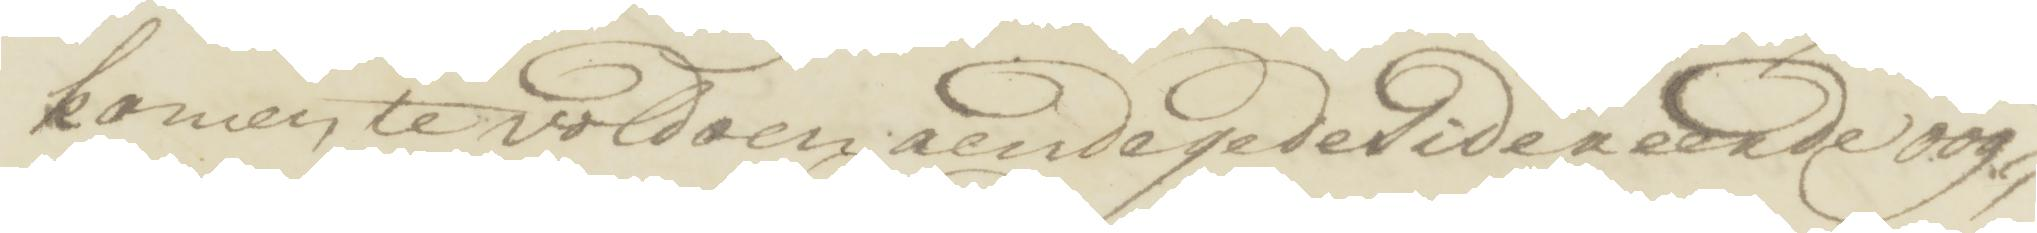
komen te voldoen aende gedesidereerde oog
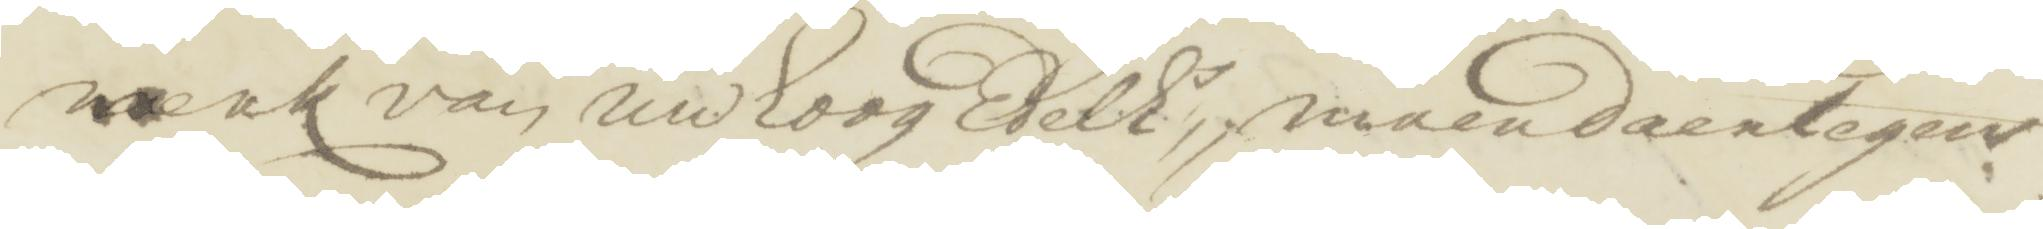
werk van uw hoog Edelh„s maer daer tegens
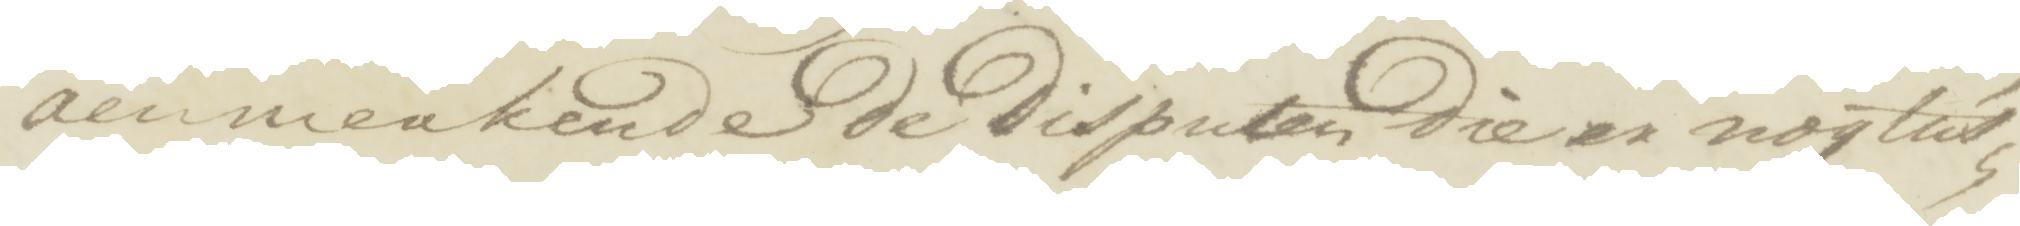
aenmerkende de disputen die er nog tus„
